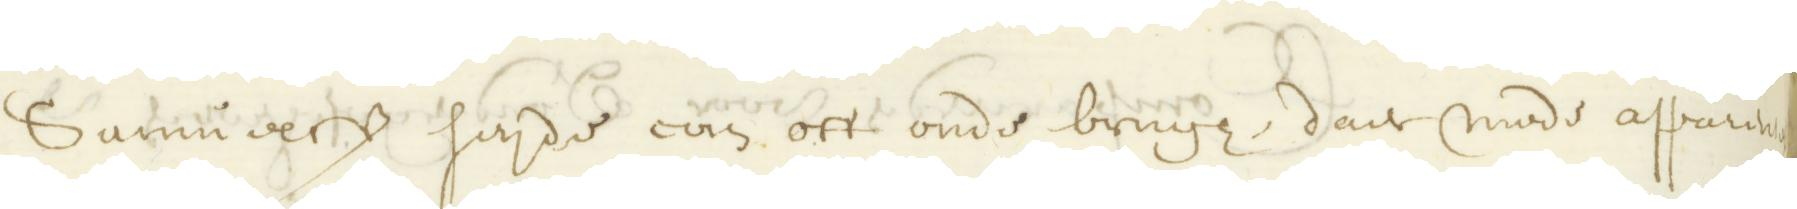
Samuelsz seyde com off oude bruijen, daer mede apparen
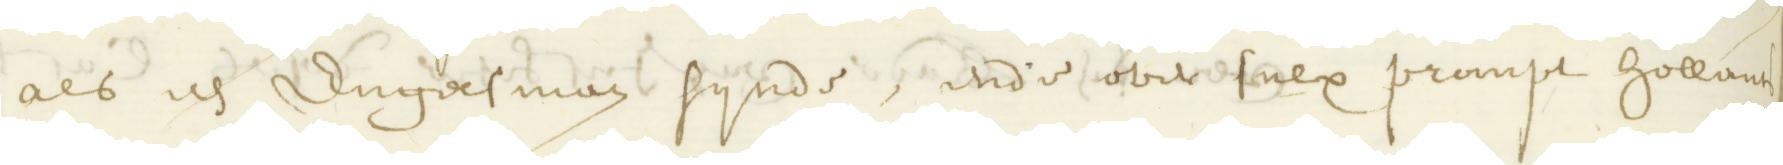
als een Engelsman sijnde, ende over sulx prompt hollands
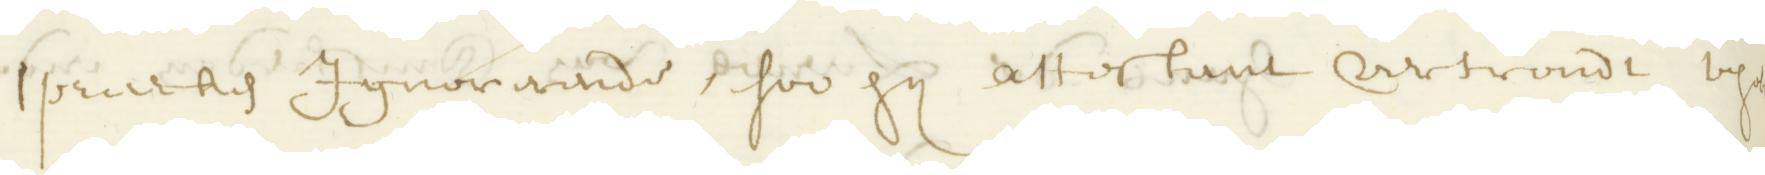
spreecken Ignorerende, soo hij attestant vertrondt vij
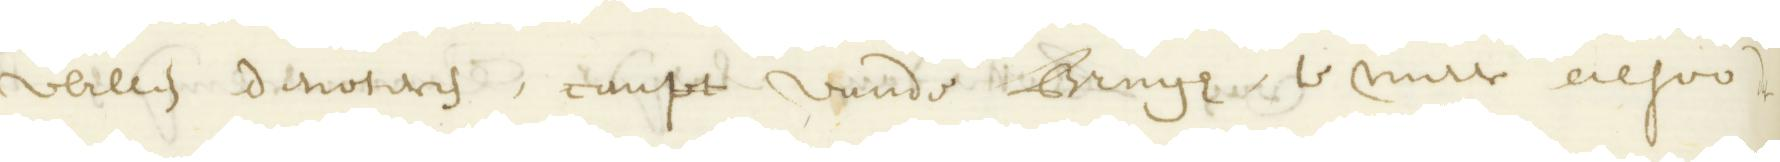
vallen denoteren, compt vande Bruijen, te meer alsoo
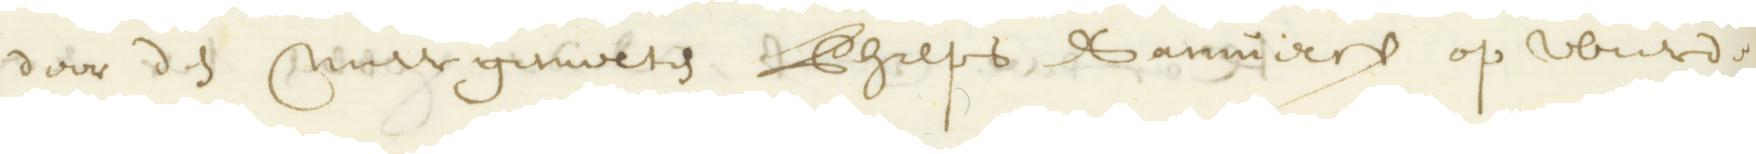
door den meergemelten Philps Samuelsz op wierde
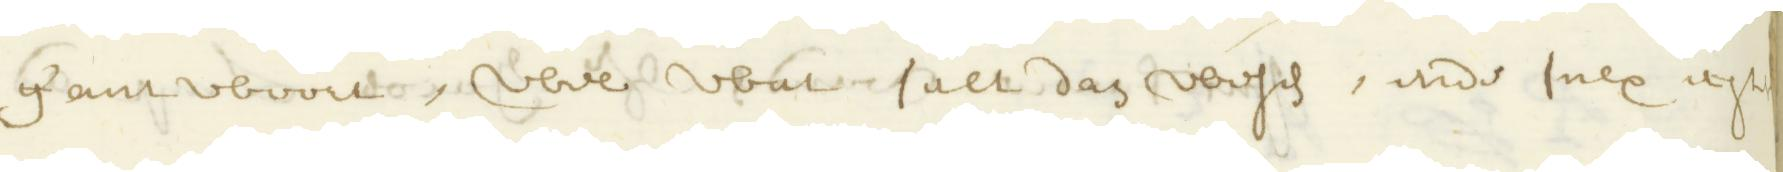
gant woort, wel wat salt dan wesen, ende sulx agter
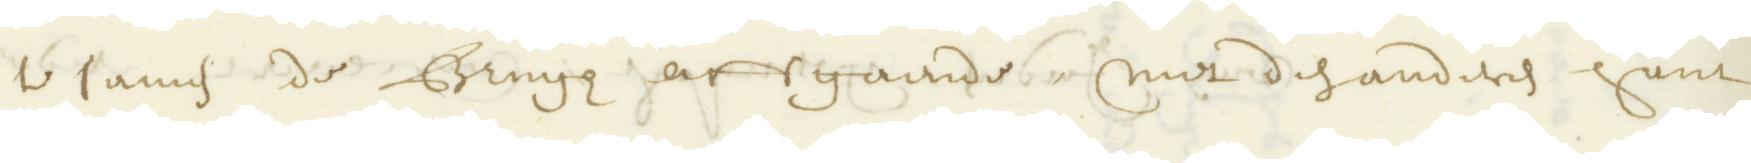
te samen de Bruijen affgaende met den anderen hant
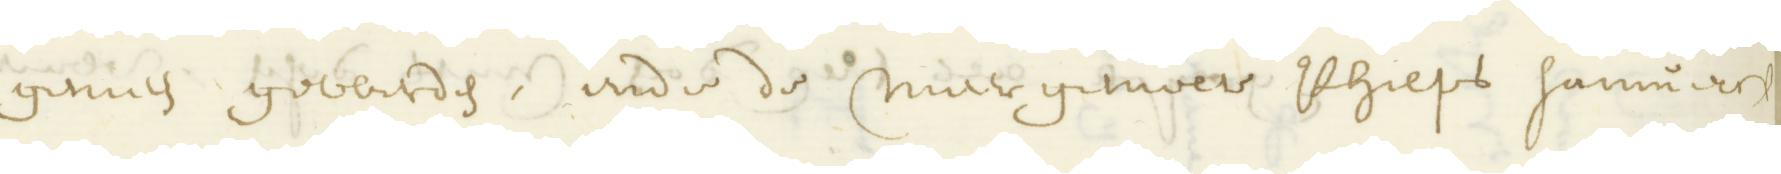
gemeen gewerden, ende de meergemelte philps samuelsz
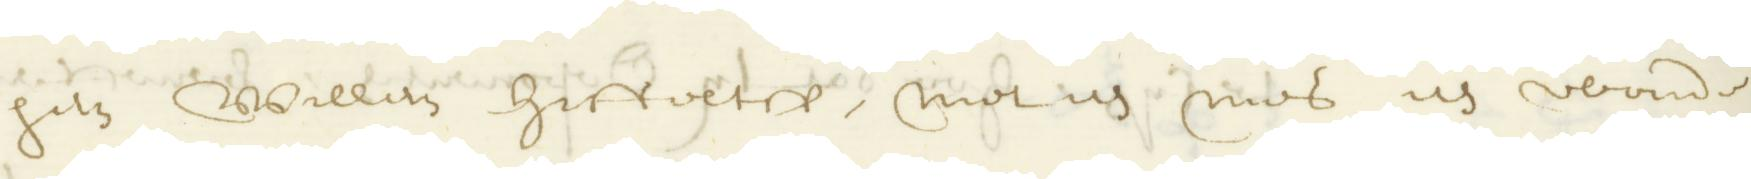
hem willem histeltst, met een mes een wonde
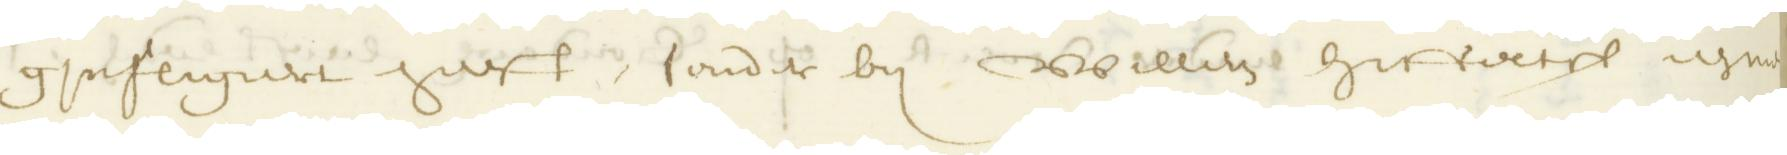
gpifligeert heeft, sonder bij willem histeltst eenme
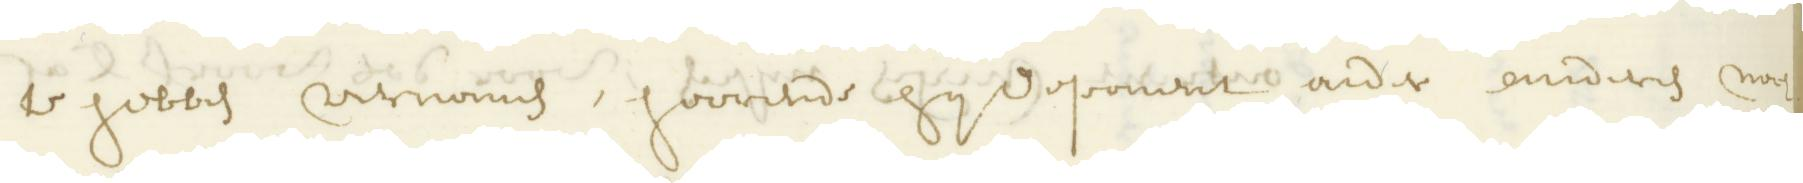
te hebben vernomen, hoorende hij deponent onder anderen wij
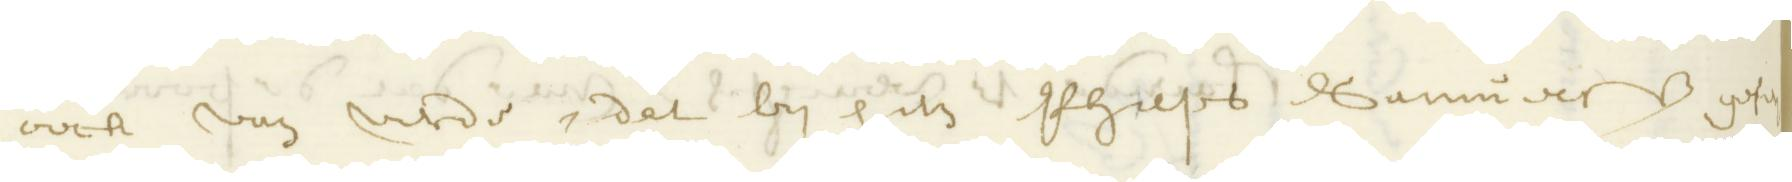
oock van verde, dat bij sijn philps samuelsz gesen
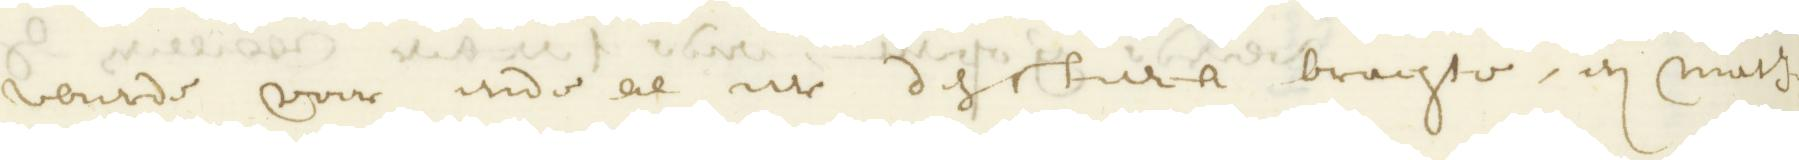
weerde voor ende al eer des steeck brachte, en math
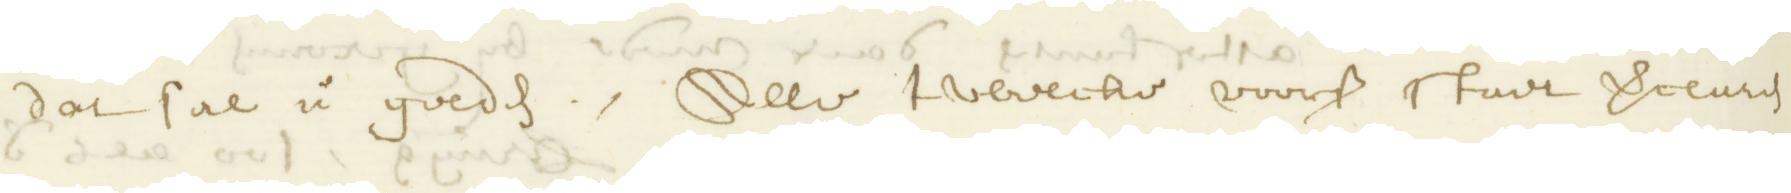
dat sal u goeden, Elle t welcke voors staet verclaren
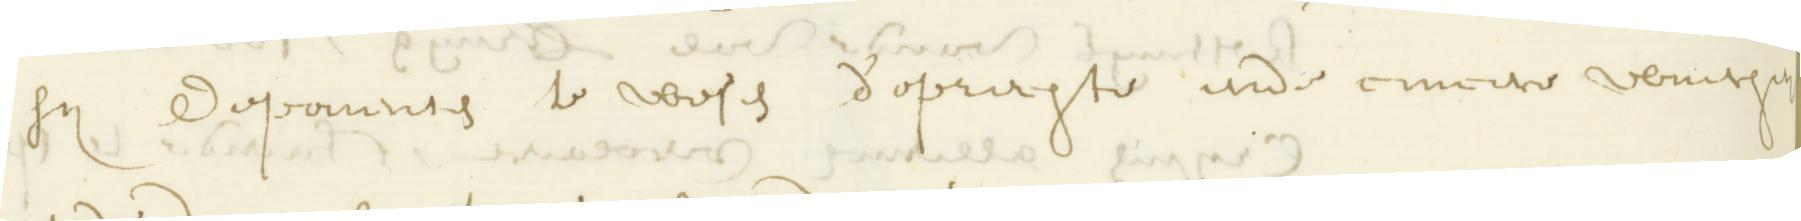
sij Deponenten te wesen d' oprechte ende omoen warthen
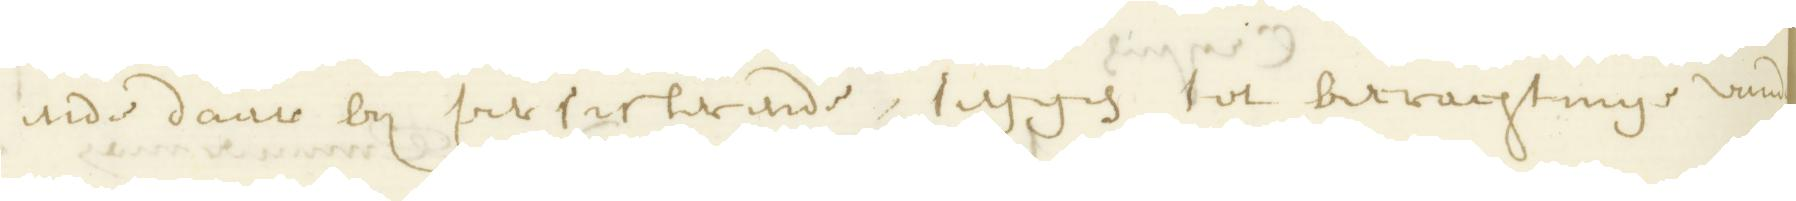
ende daer bij persisterende, teijgen tot becrachtinije van
